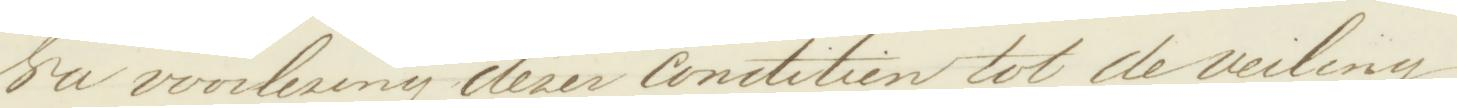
Na voorlezing dezer conditien tot de veiling
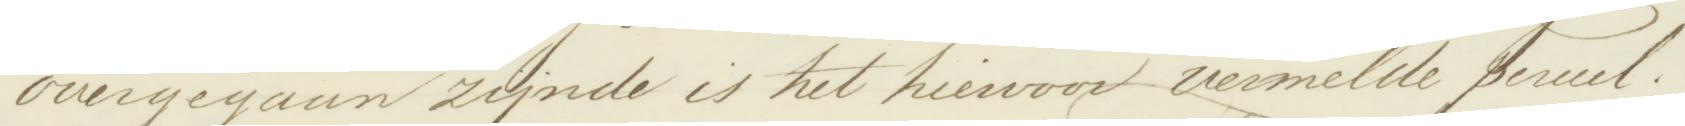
overgegaan zijnde is het hiervoor vermelde perceel.
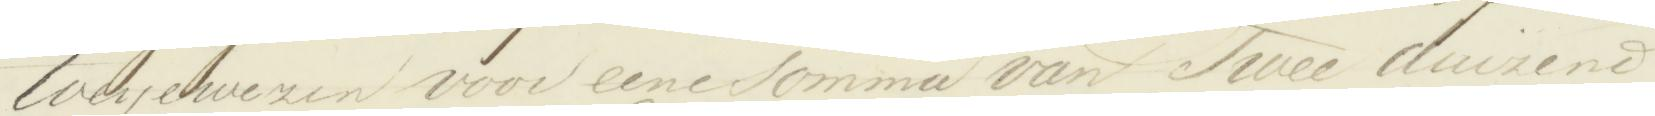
toegewezen voor eene somma van Twee duizend
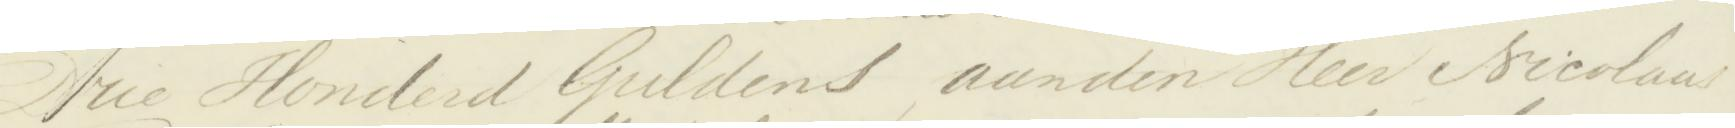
Drie Honderd Guldens aan den Heer Nicolaas
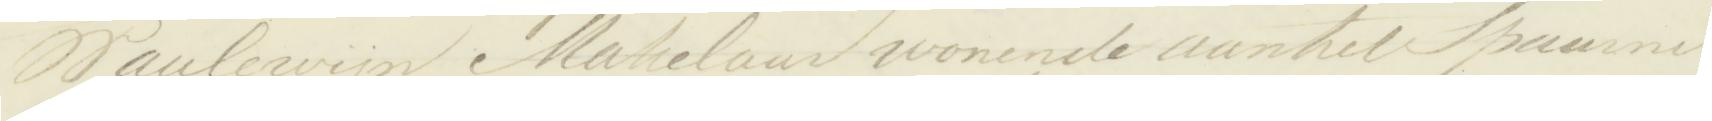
Waulewijn Makelaar wonende aan het Spaarne
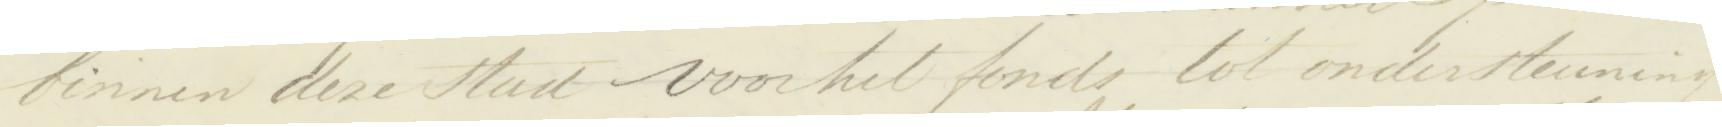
binnen deze stad voor het fonds tot ondersteuning
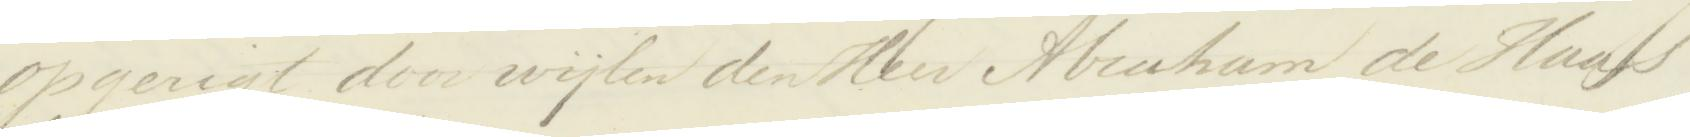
opgerigt door wijlen den Heer Abraham de Haass
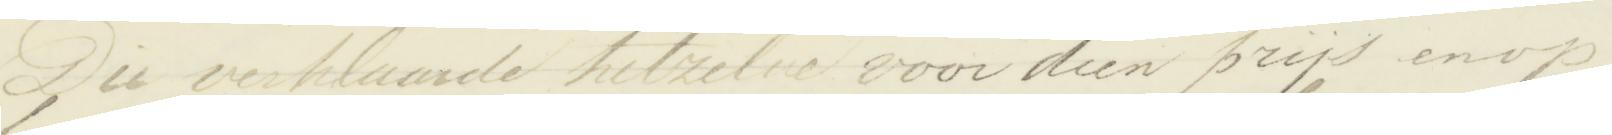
Die verklaarde hetzelve voor dien prijs en op
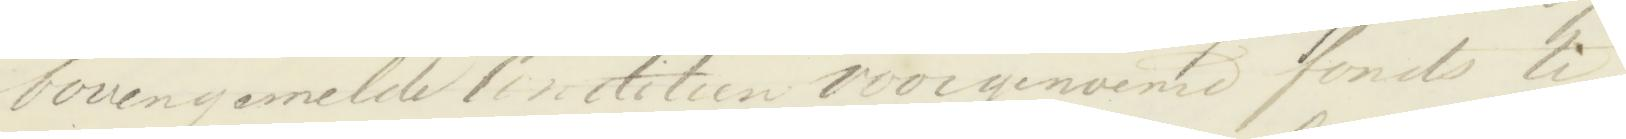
bovengemelde Conditien voorgenoemd fonds te
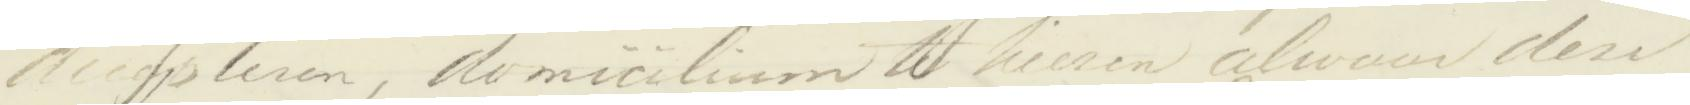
Accepteren, domicilium te kiezen alwaar deze
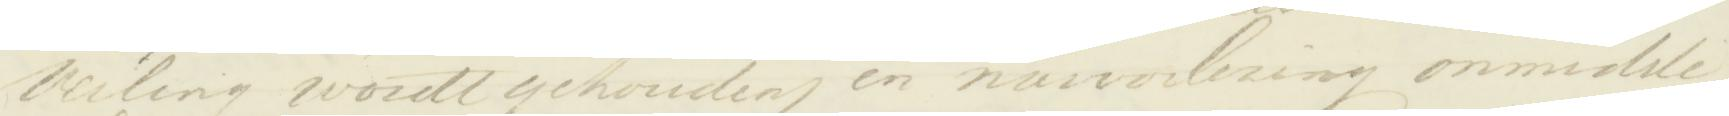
veiling wordt gehouden, en na voorlezing onmidde
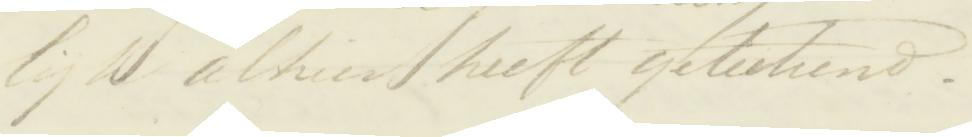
lijk alhier heeft geteekend.
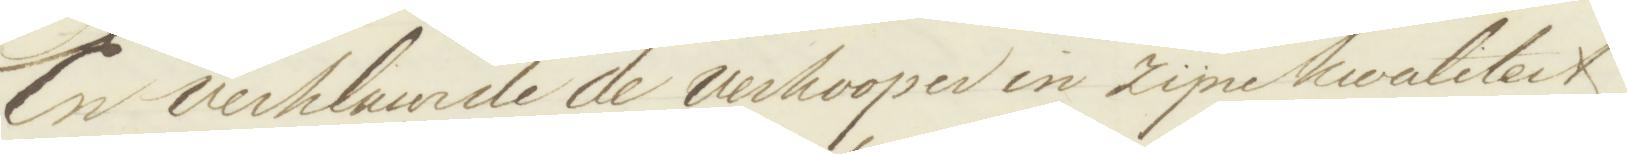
En verklaarde de verkooper in zijne kwaliteit
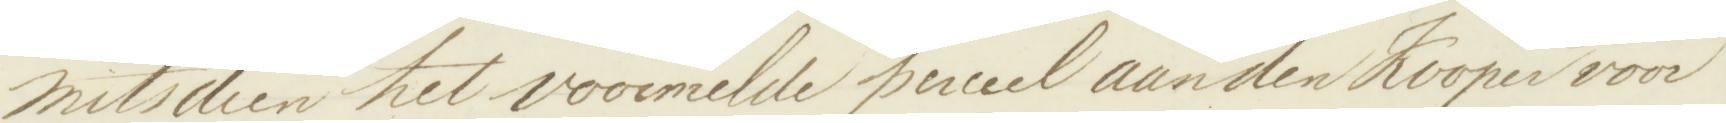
mitsdien het voormelde perceel aan den Kooper voor
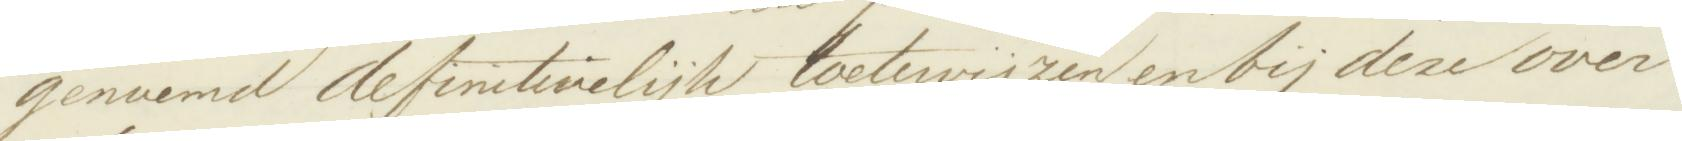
genoemd definitivelijk toetewijzen en bij deze over
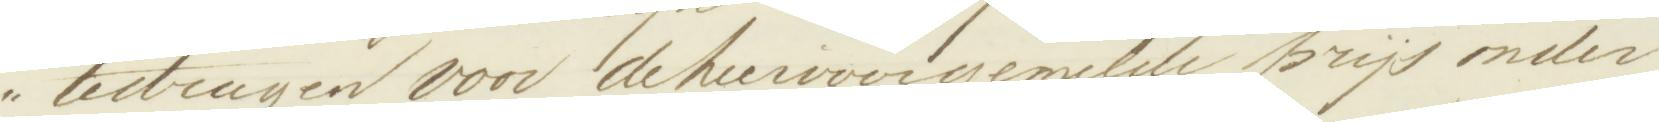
„tertragen voor de hiervoor gemelde prijs onder
